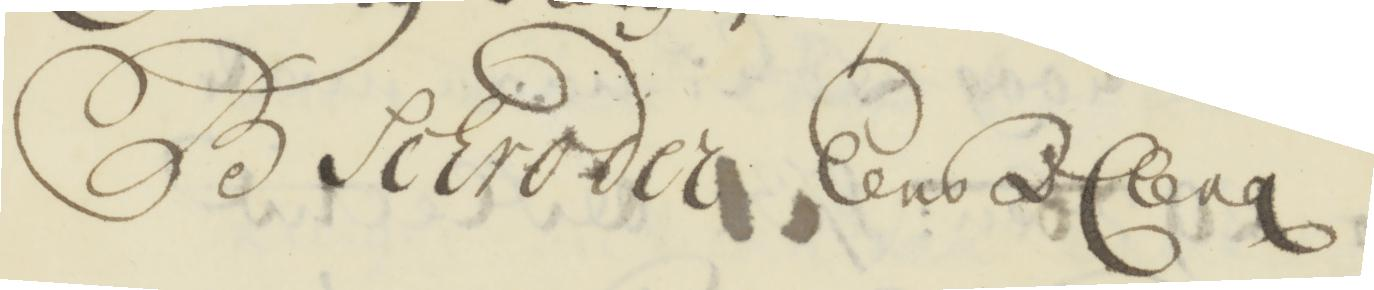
B Schroder Eerste Clerq
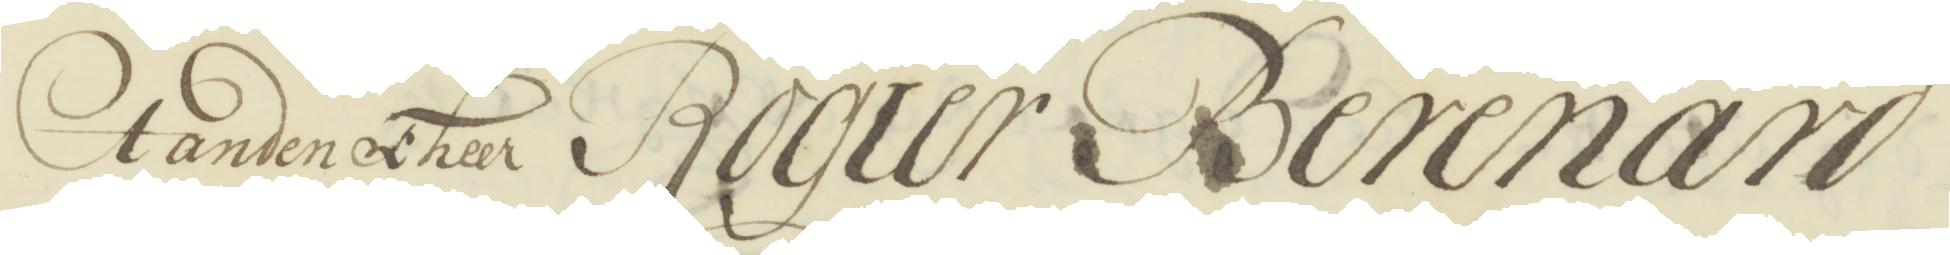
Aanden E heer Rogier Berenard
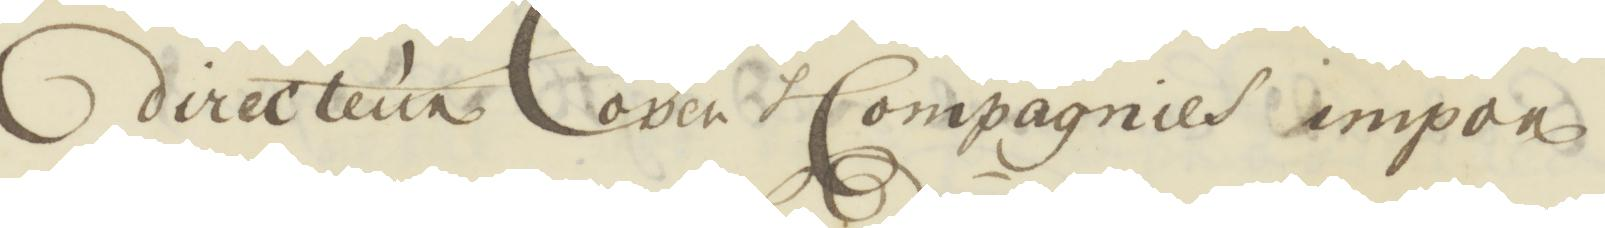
directeur over 's Compagnies impor
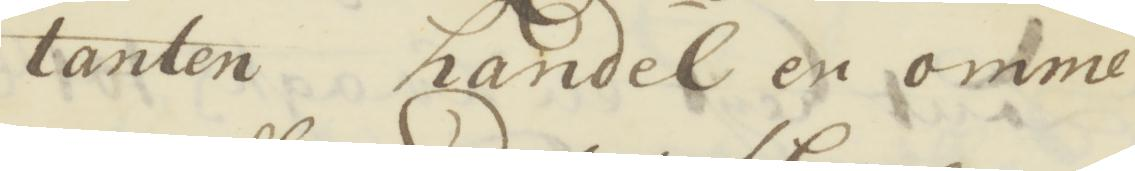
tanten handel en omme
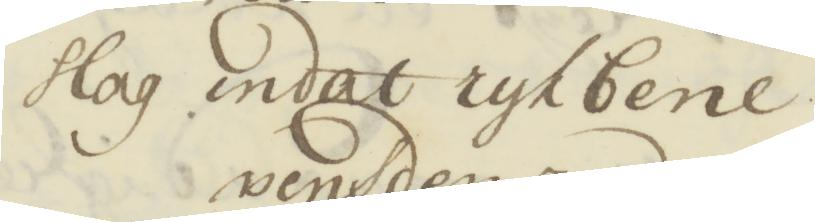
slag in dat ryk bene
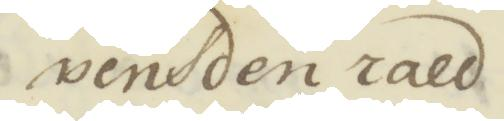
vensden raed
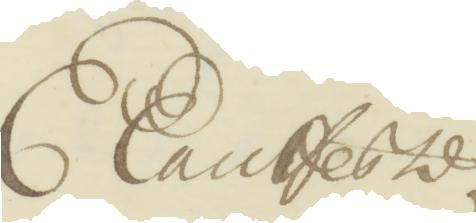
E Erntfeste,
